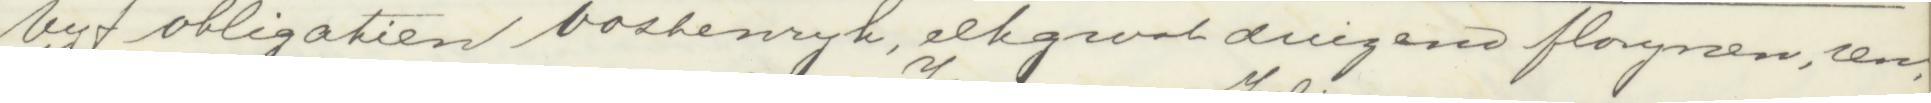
vyf obligatien Oostenryk, elk groot duizend florynen, ren,
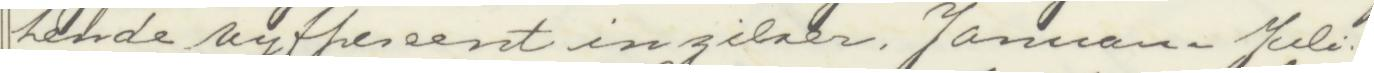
tende vyfpercent in zilver, Januari en Juli
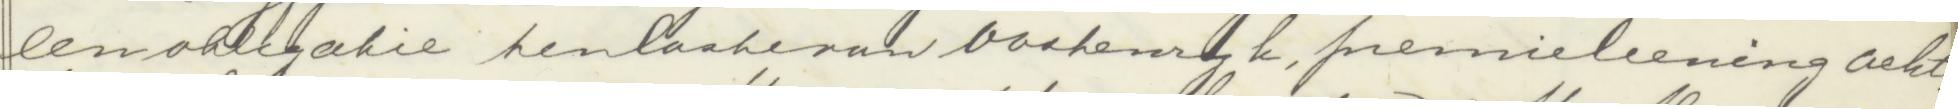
Een obligatie ten laste van Oostenryk, premieleening acht.
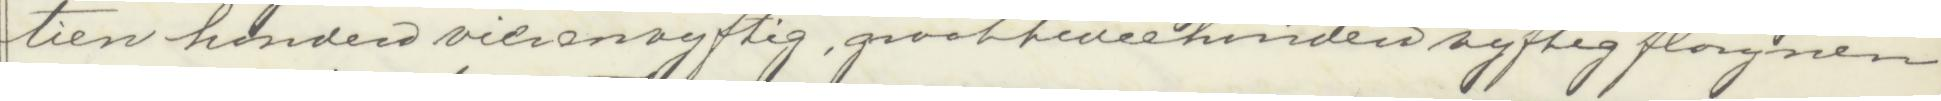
tien honderd vierenvyftig, groot tweehonderd vyftig florynen
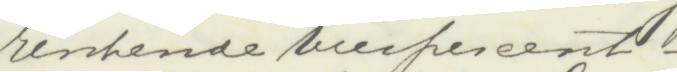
rentende vierpercent
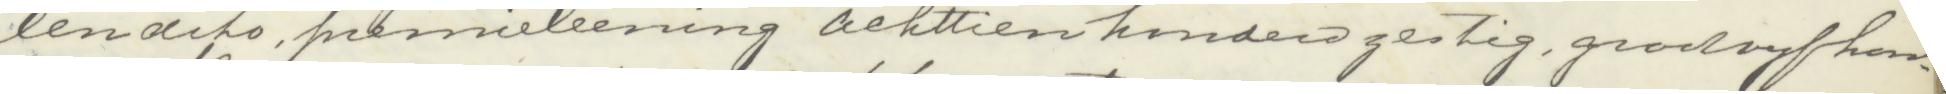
een dito, premieleening achttien honderd zestig, groot vyf hon„
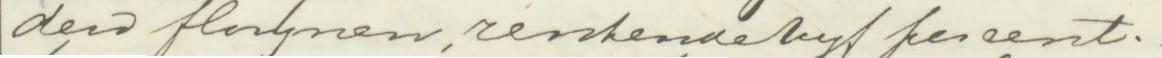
den florynen, rentende vyf percent.
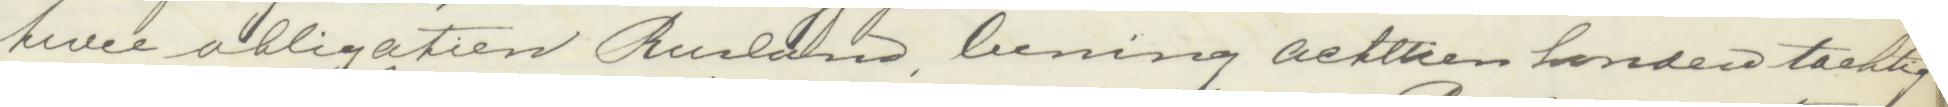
twee obligatien Rusland leening achttien honderd tachtig
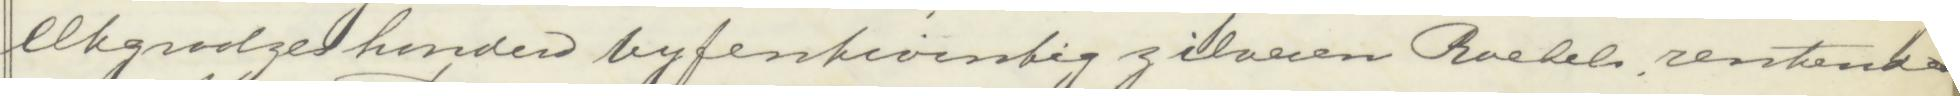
Elk groot honderd vyfentwintig zilveren Roebels, rentende
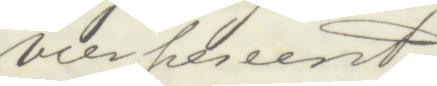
vier percent
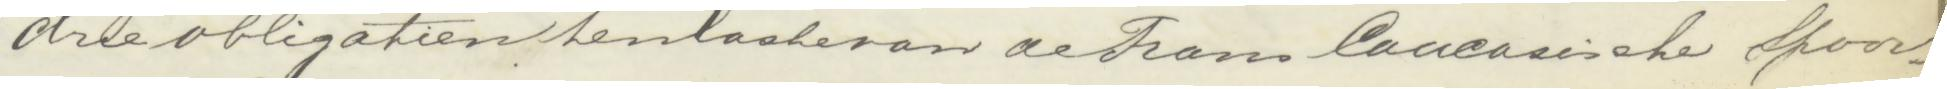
drie obligatien ten laste van de Trans Caucasische Spoor=
